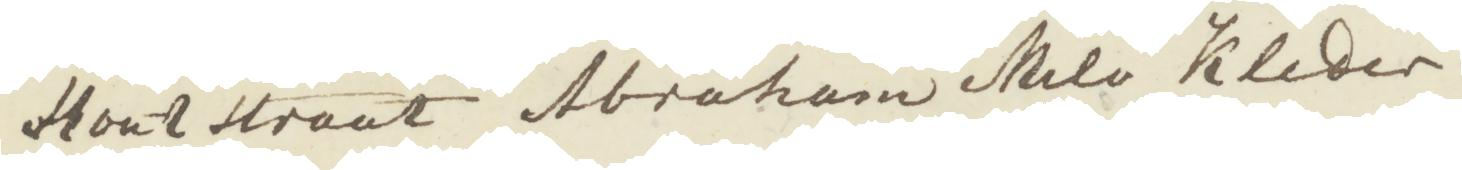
Hout straat Abraham Milo Kleder
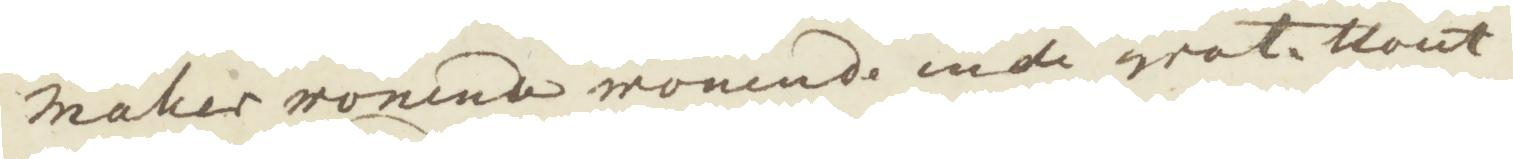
maker wonende wonende in de grote hout
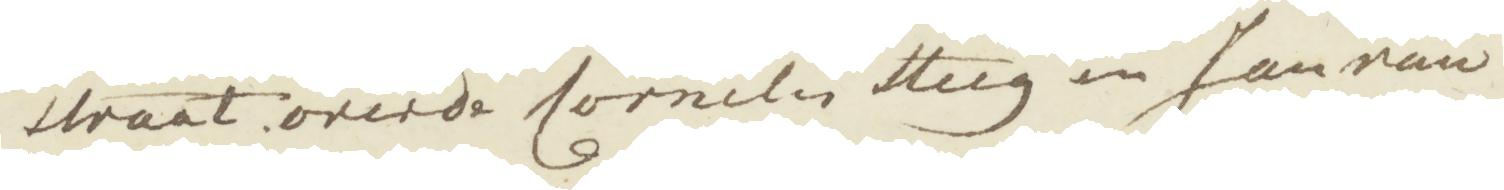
straat over de Cornelis steeg in Jan van
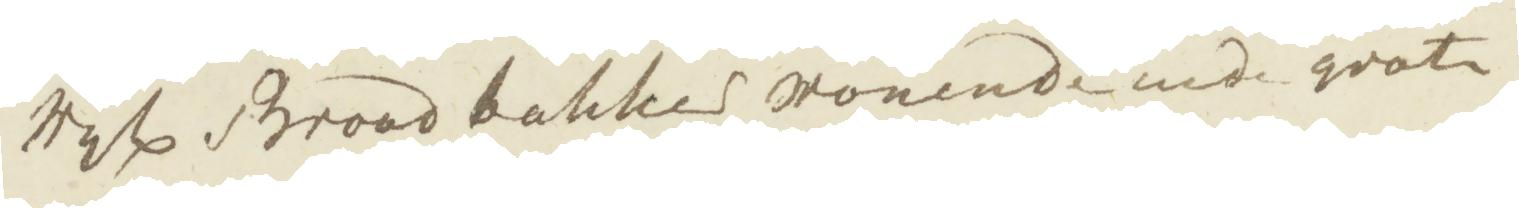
Wyk Brood bakker wonende inde grote
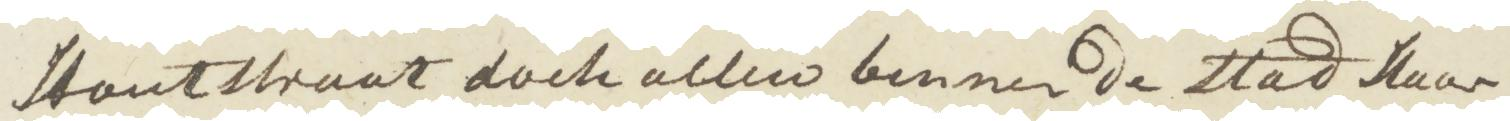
Houtstraat doch allen binnen de stad Haar
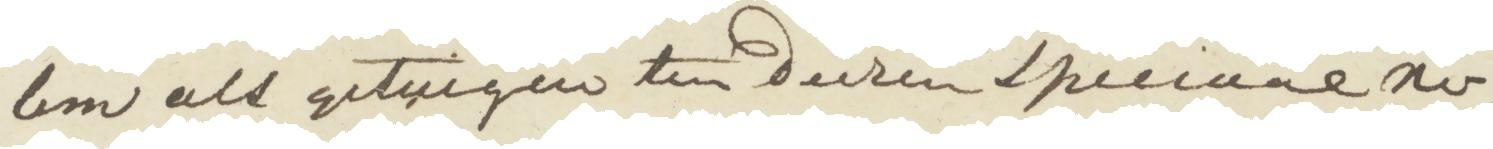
lem als getuigen ten deezen speciaal ver
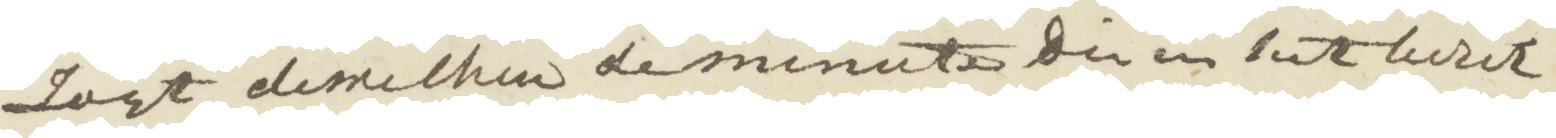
zogt dewelken de minute die in het bezit
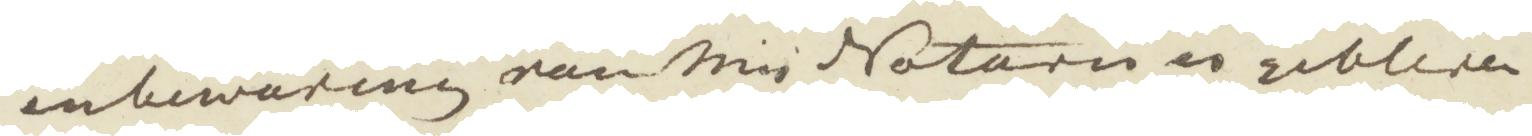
en bewaring van mij Notaris is gebleven
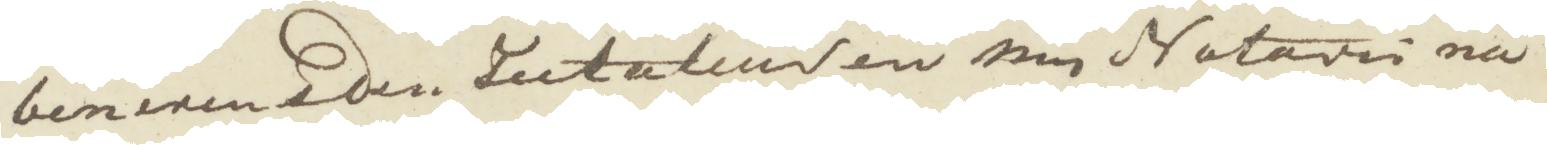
beneven den Testateur en mij Notaris na
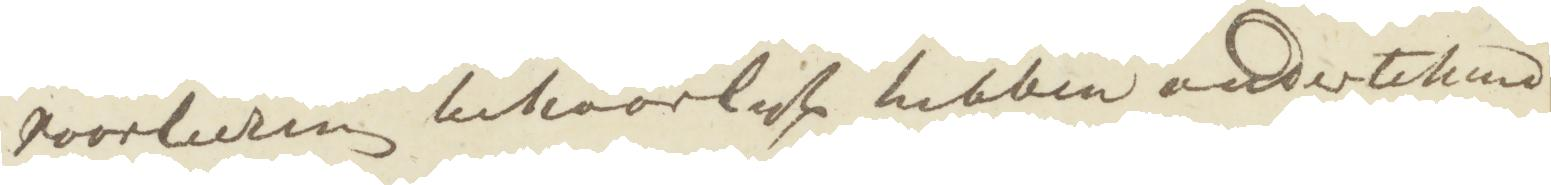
voorleezing behoorlyk hebben ondertekend
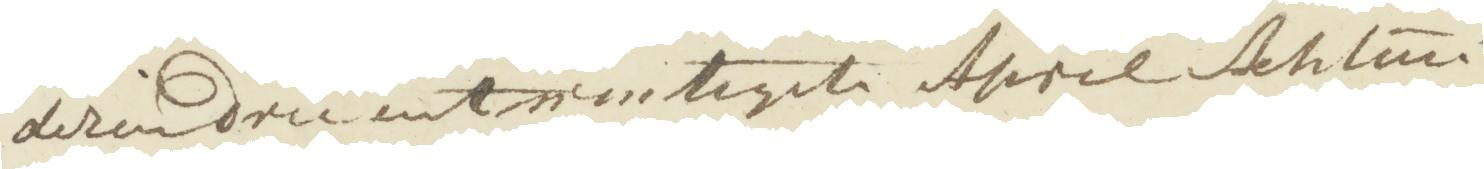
dezen drie en twintigste April Achtien
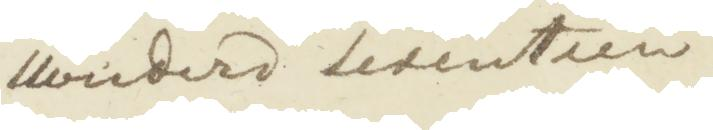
honderd zeventien
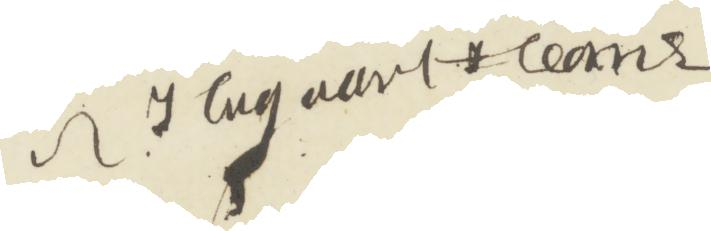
R.J lugaart Hoorns
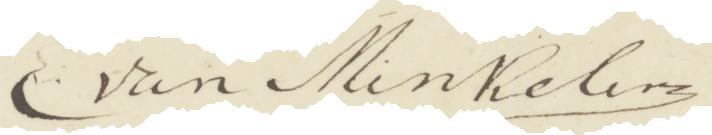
C: van Minkelen
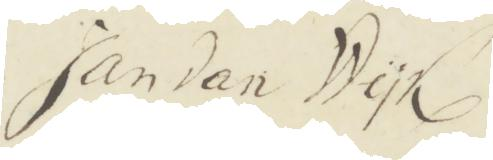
Jan van Wijk
